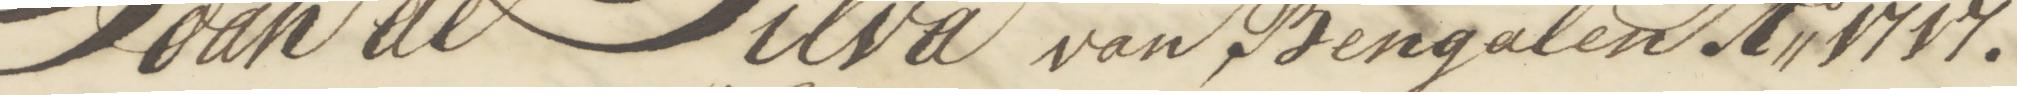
Joan de Silva van Bengalen A„o 1717.
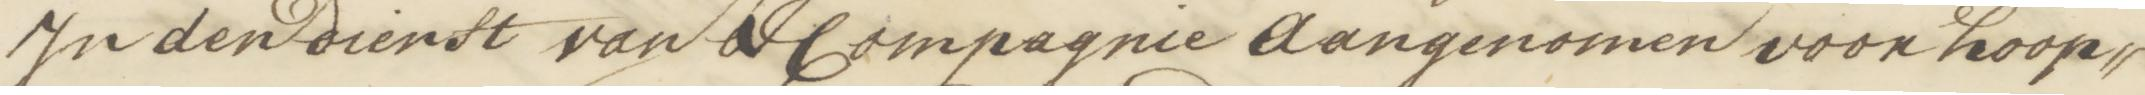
In den dienst van d' Compagnie aangenomen voor hoop„
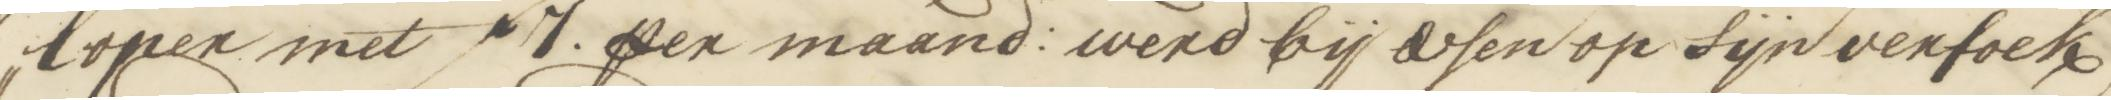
lopen met ƒ 7. per maand: werd bij desen op sijn versoek
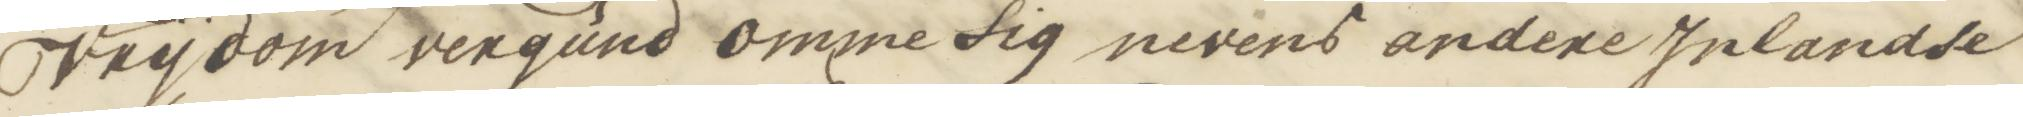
vrijdom vergund omme sig nevens andere Inlandse
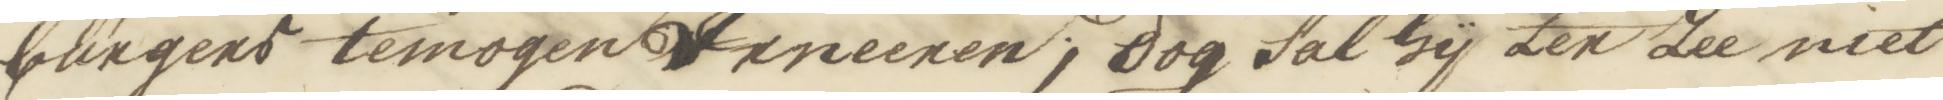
burgers te mogen Erneeren, dog sal hij ter zee niet
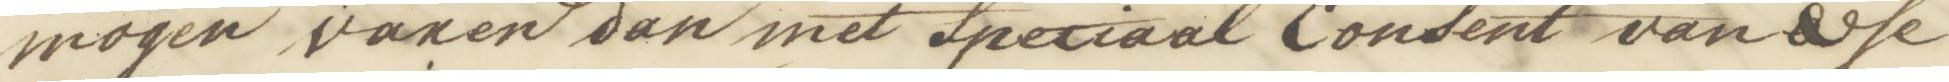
mogen varen dan met speciaal consent van dese
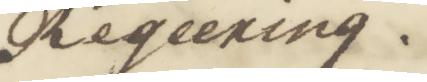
Regeering.
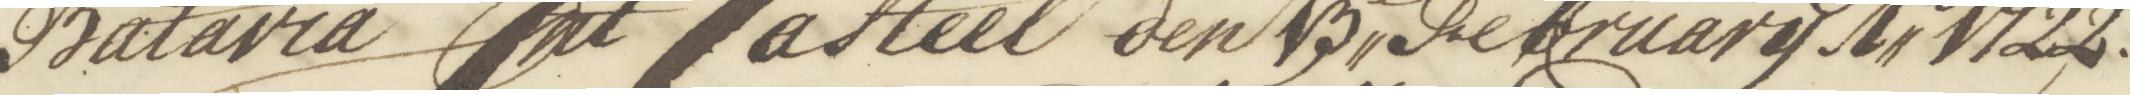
Batavia In't Casteel den 13„e Februarij A„o 1722.
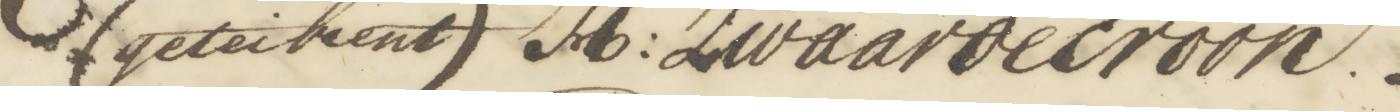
(geteikent) H: Zwaardecroon.
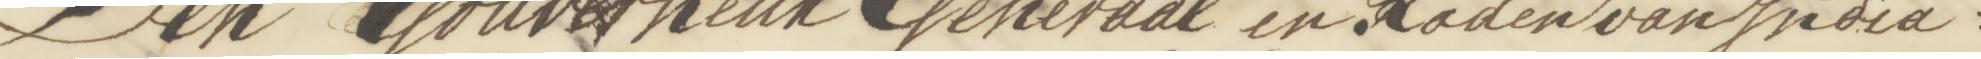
Den Gouverneur Generaal in Raden van India
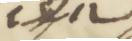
ien
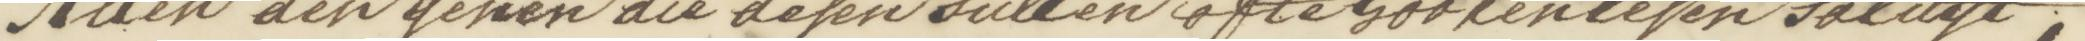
Allen den genen die desen sullen ofte hooren lesen sal uijt,
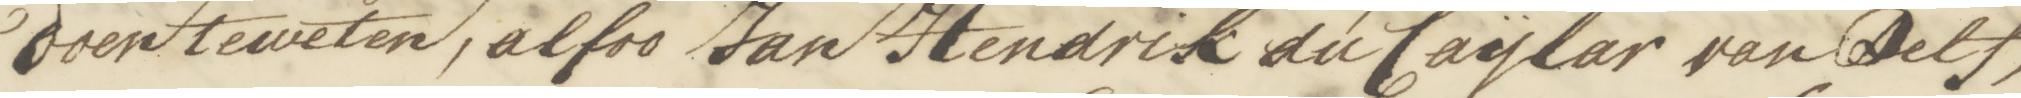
doen te weten, alsoo Jan Hendrik du Caijlar van Delf,
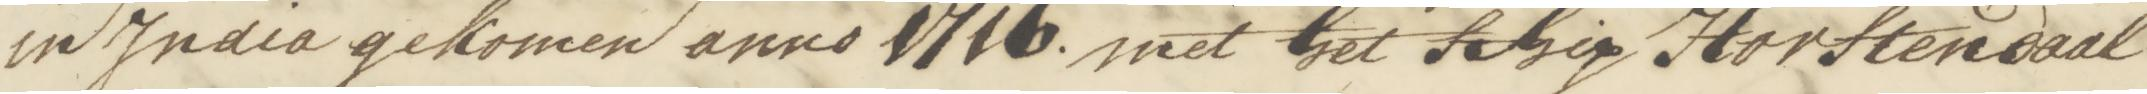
in India gekomen anno 1716. met het schip Horstendaal
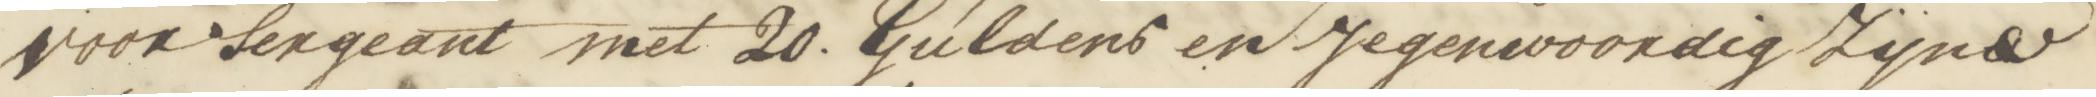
voor sergeant met 20. Guldens en jegenwoordig zijnde
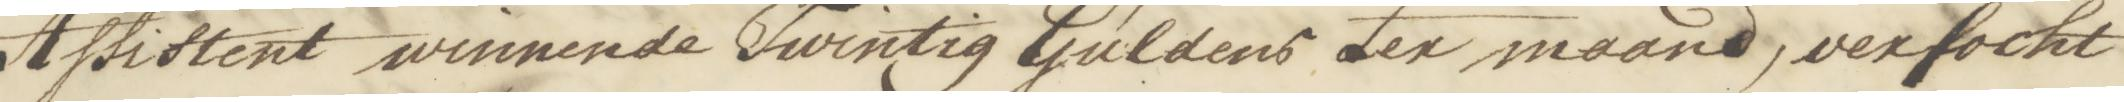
Assistent winnende Twintig Guldens ter maand, versocht
